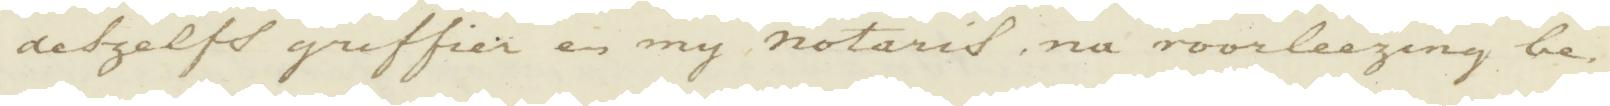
deszelfs griffier en my notaris, na voorleezing be„
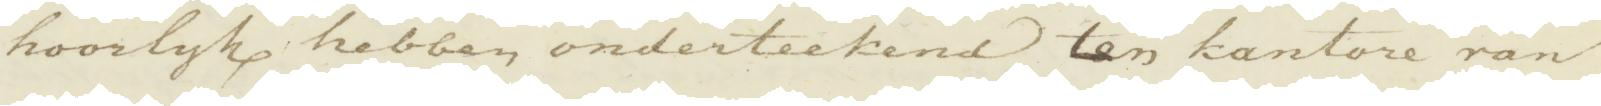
hoorlyk hebben onderteekend ten kantore van
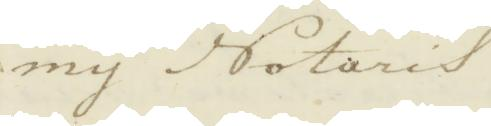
my Notaris
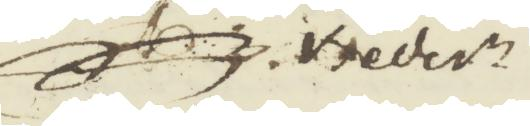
Vredr.r
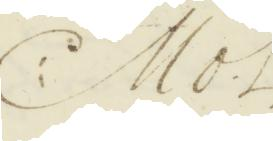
:Mol
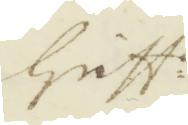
Griff:r
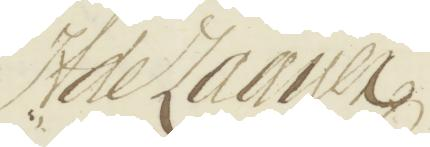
Hde Zaaijer
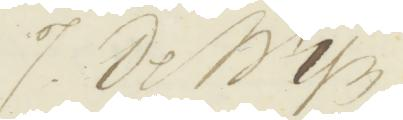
J. de Wijn
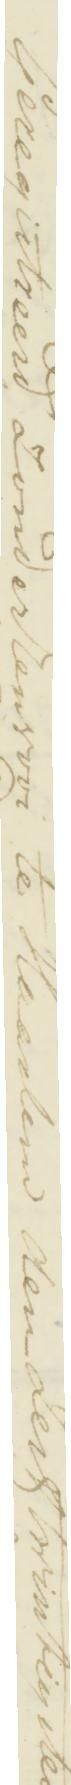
Geregistreerd zonder renvooi te Haarlem den Zes twintigsten
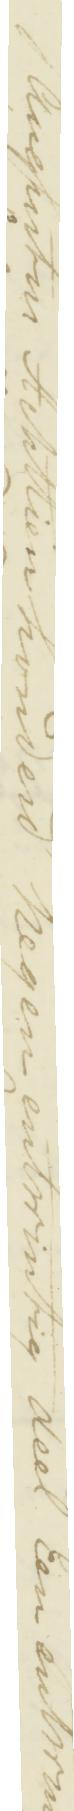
Augustus Achttien honderd Negen entwintig deel Een entwin
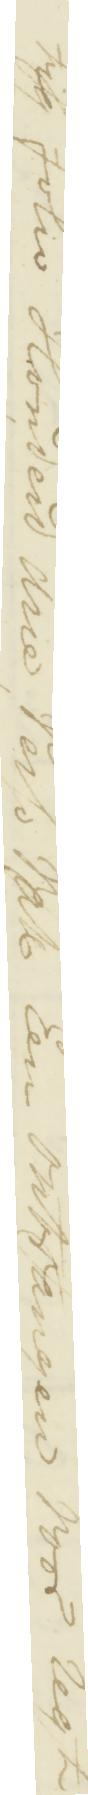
tig folio Honderd drie Verso Vak Een ontvangen voor regt
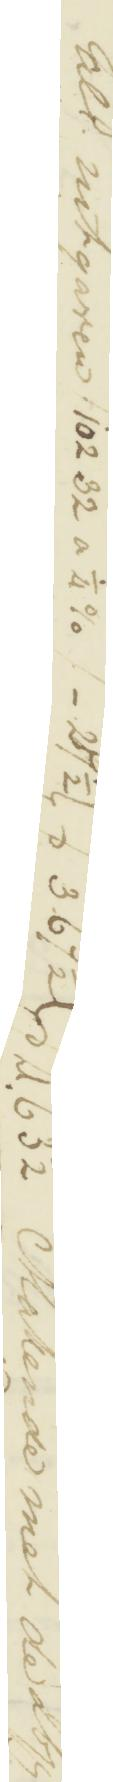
als uitgaven ƒ102 32 a ¼% - 27½ f 3.67½ f 4.63½ Makende met de 26 /c=t
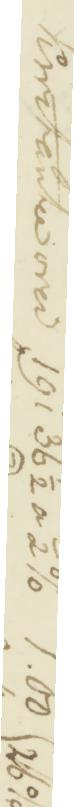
kwitantie over 191 36½ a ½% 1.00 26%
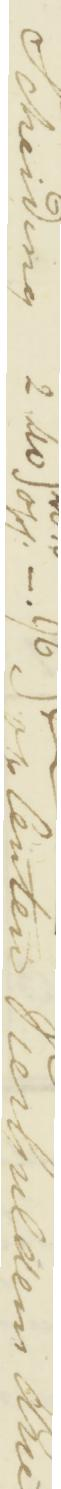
scheiding 2.40 opC. - 96 op Centen VierGuldens drie
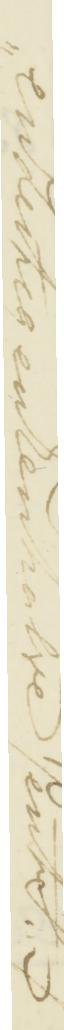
„enzestig enEenhalve Cents.
